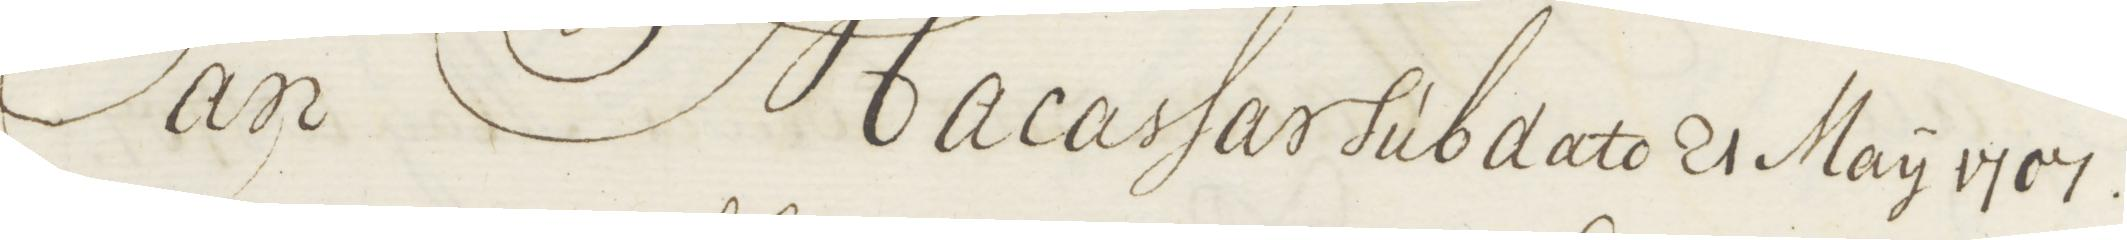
Van Macassar sub dato 21 Maij 1707.
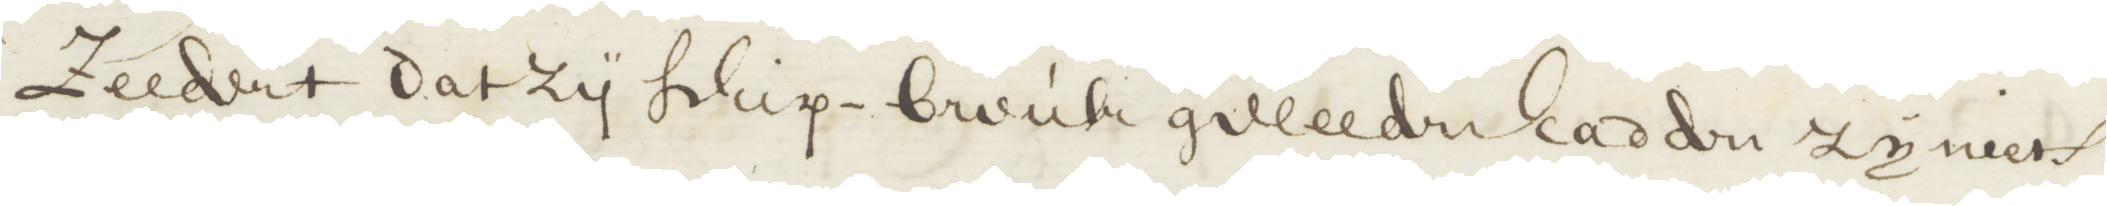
Zeedert dat zij schip-breuk geleeden hadden zij niets
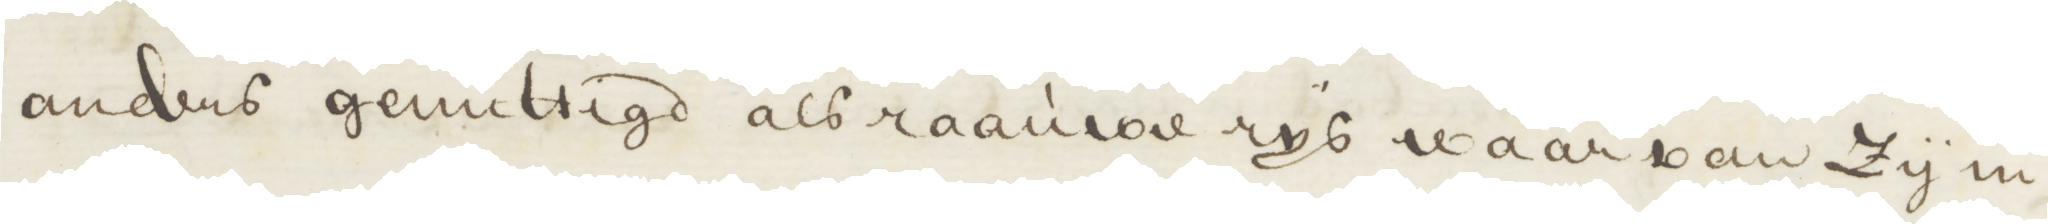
anders genuttigd als raauwe rijs waar van zij in
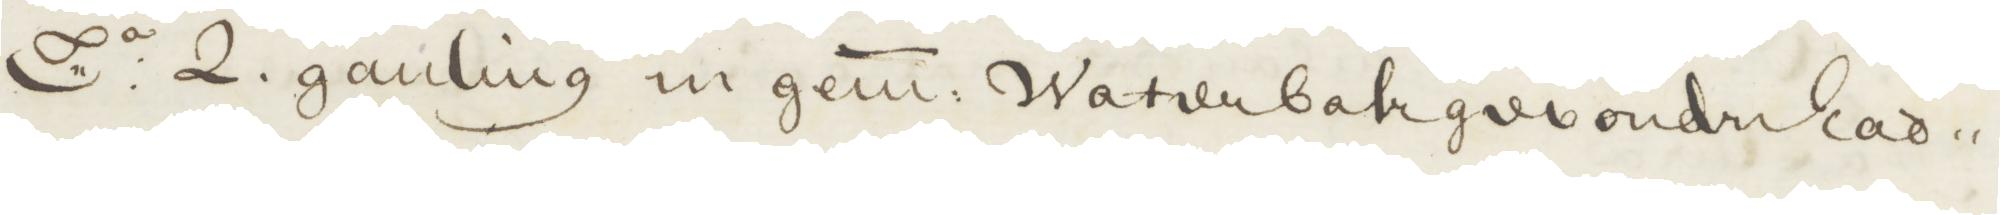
C:a 2. ganting in gem: Waterbak gevonden had„
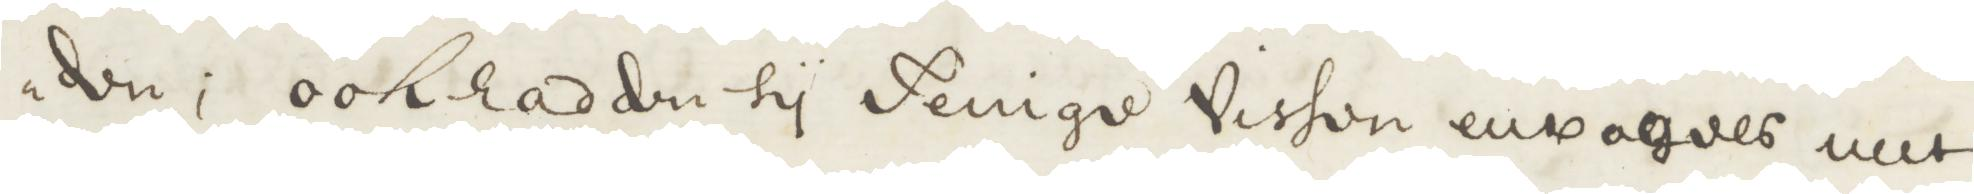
„den; ook hadden sij Eenige vissen en vogels met
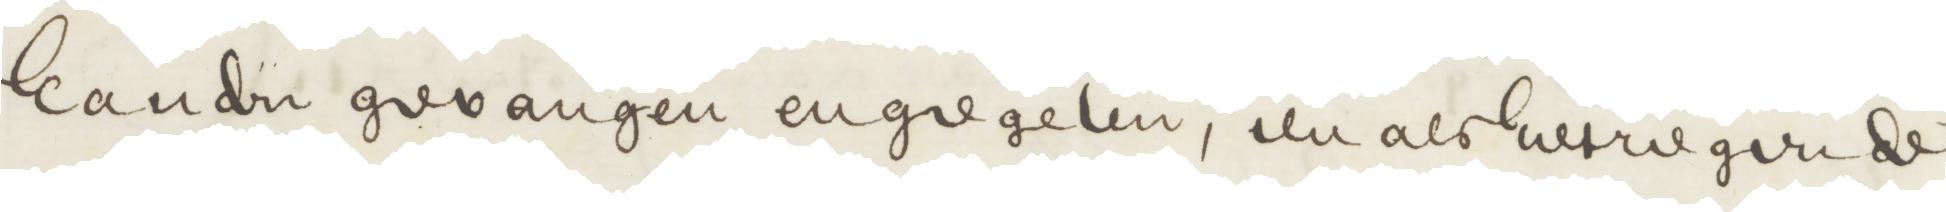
handen gevangen en gegeten, en als het regende
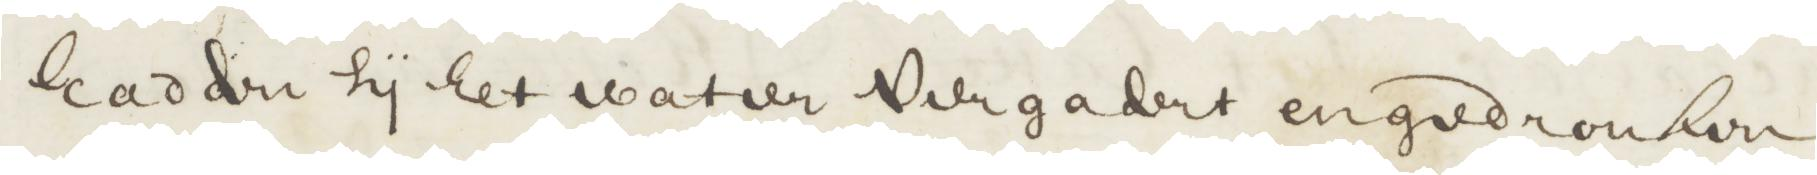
hadden sij het water vergadert en gedronken
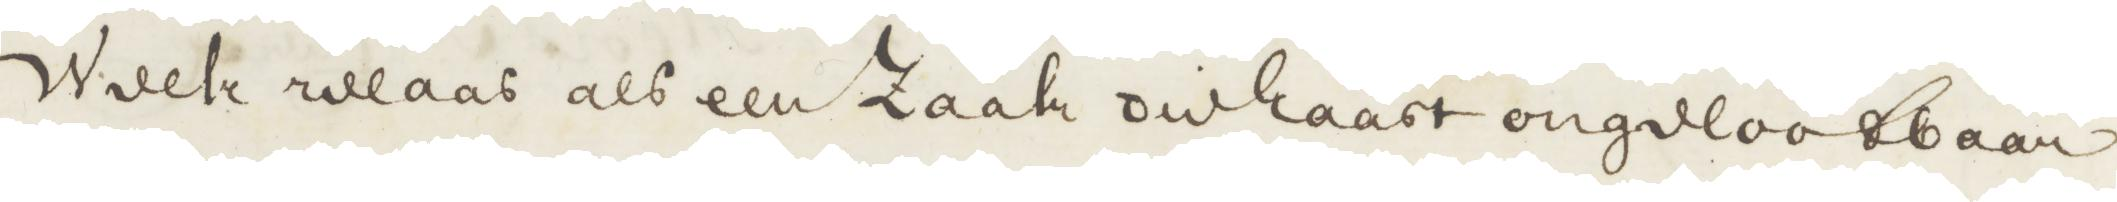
Welk relaas als een zaak die haast ongeloofbaar
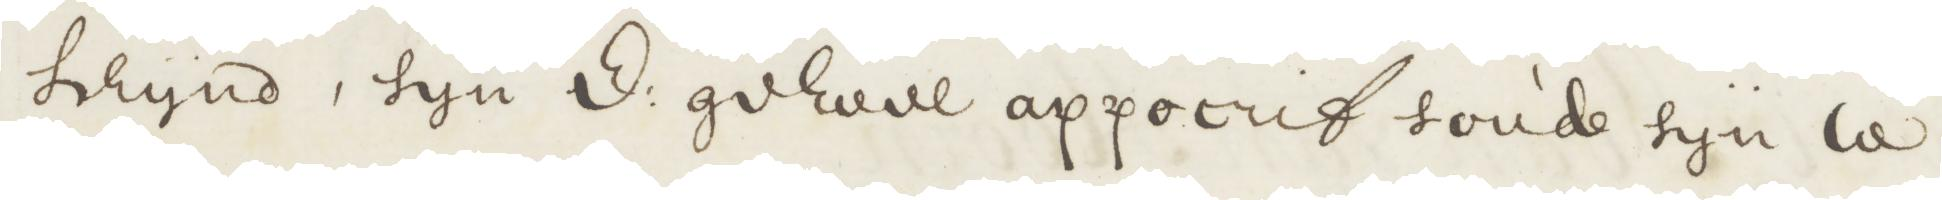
schijnd, sijn E: geheel appocrif soude sijn te
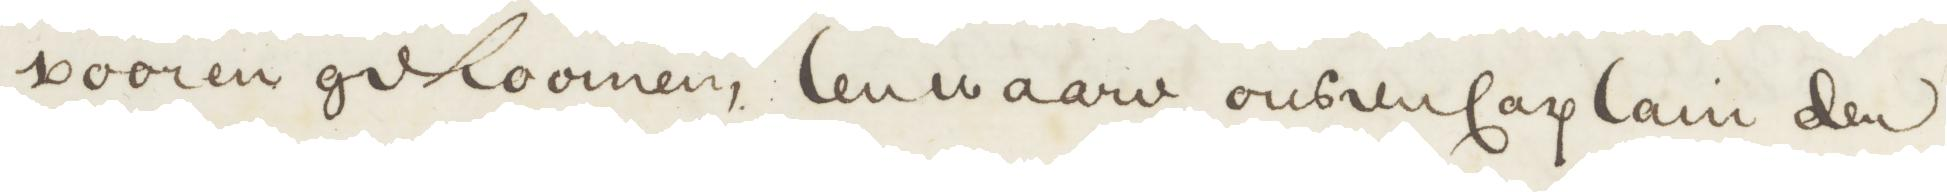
vooren gekoomen, ten waare onsen Captain der
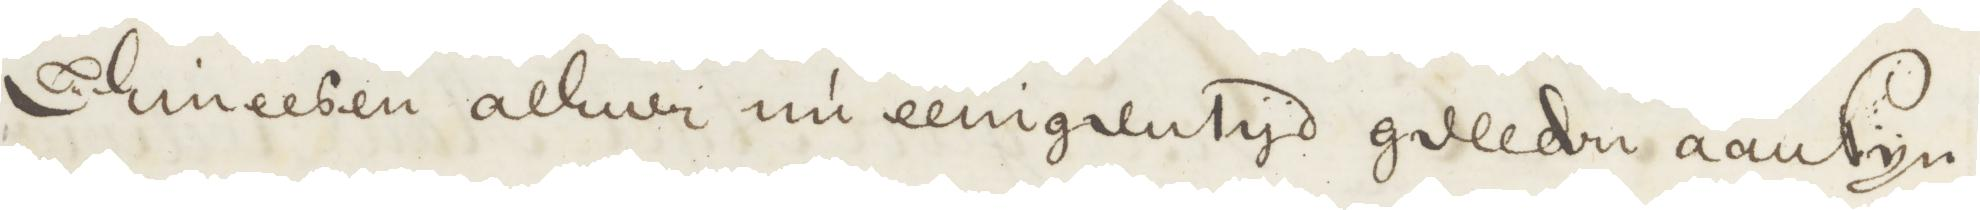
Chineesen alhier nu eenigen tijd geleden aan sijn
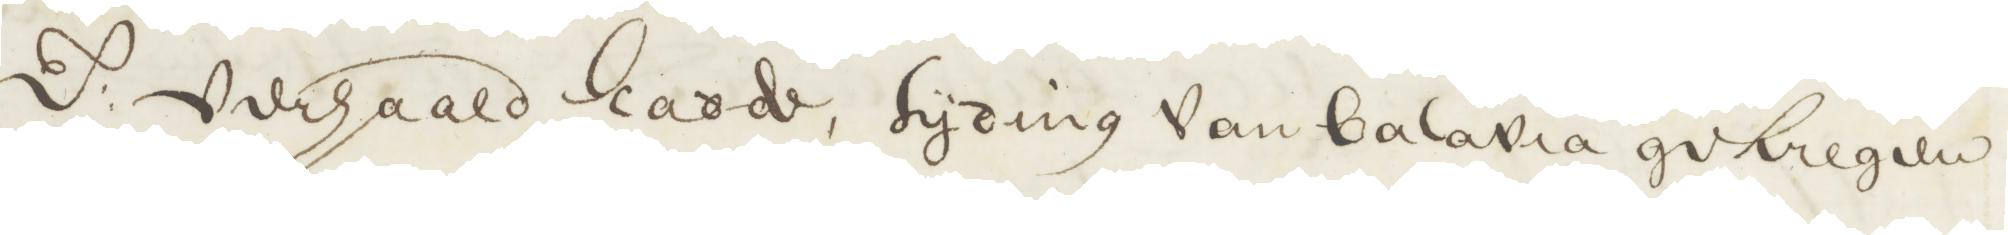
E: verhaald hadde, tijding van batavia gekregen
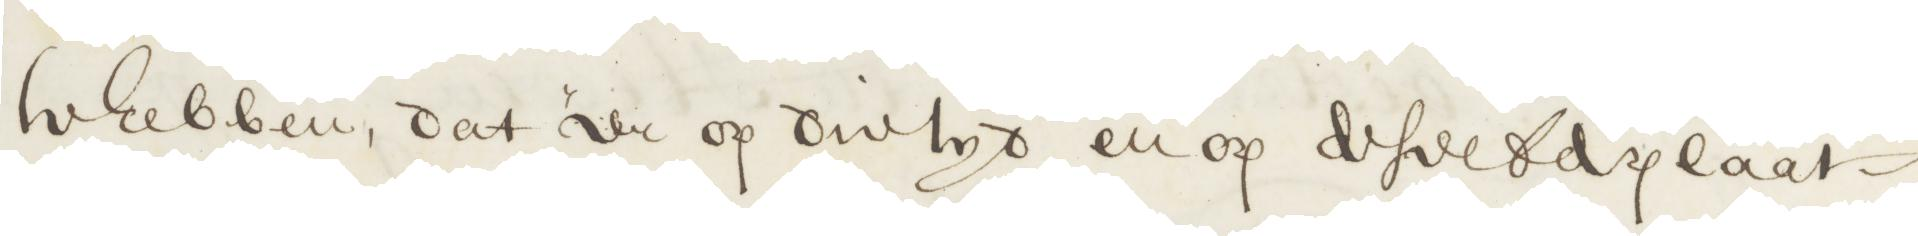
te hebben, dat er op die tijd en op deselfde plaats
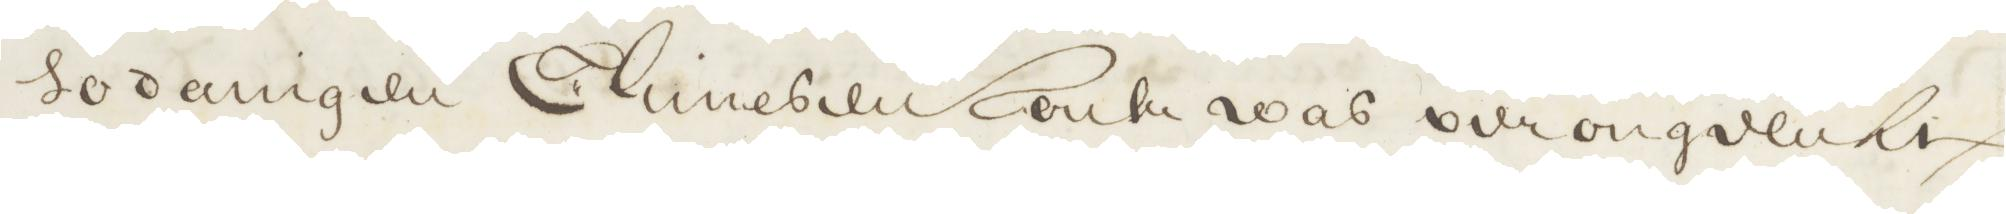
sodanigen Chinesen zonk was verongelukt
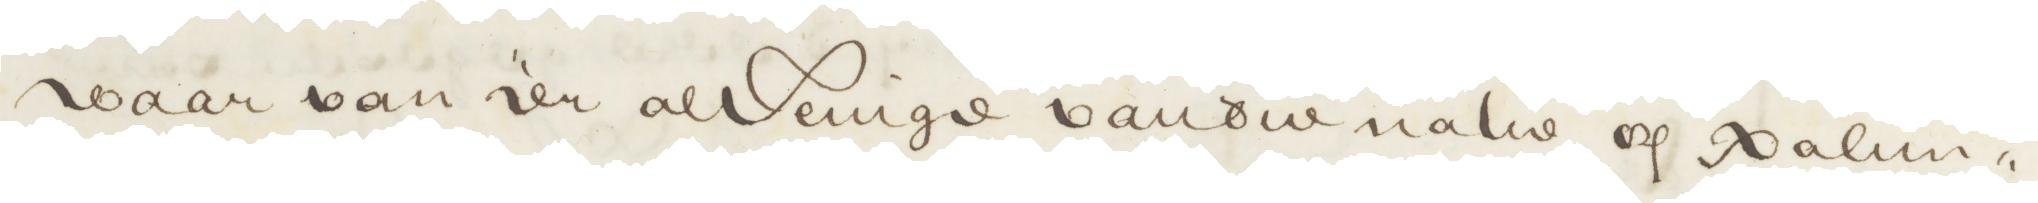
waar van er al Eenige van die natie op palim„
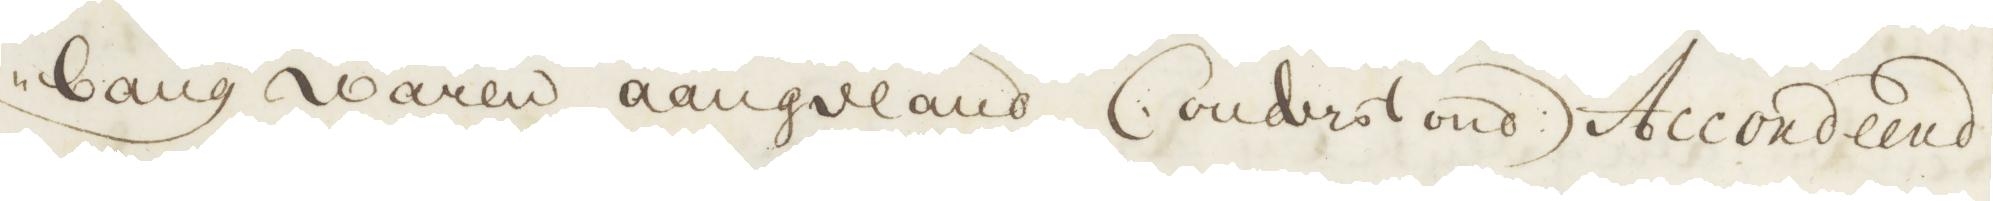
„bang waren aangeland (:onderstond:) Accordeerd
